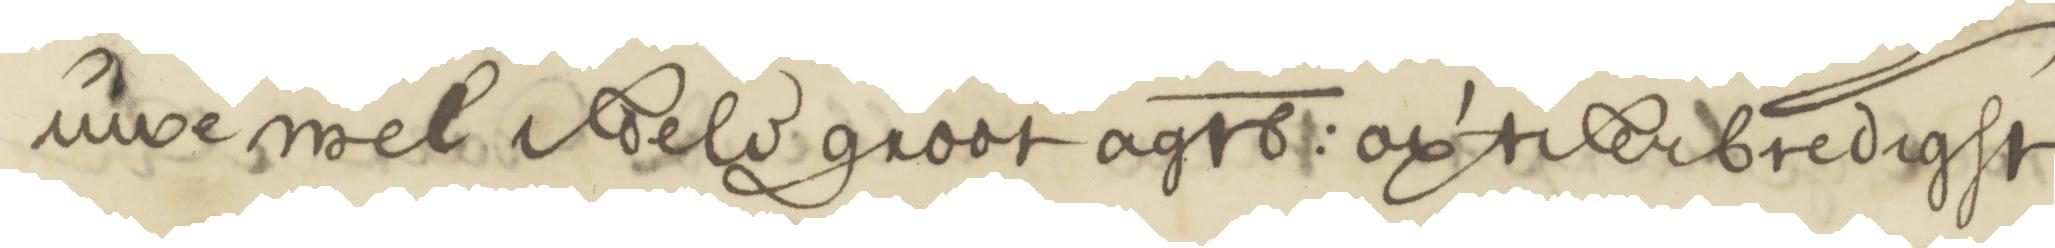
uwe wel Edele groot agtb: op’t Eerbiedigst
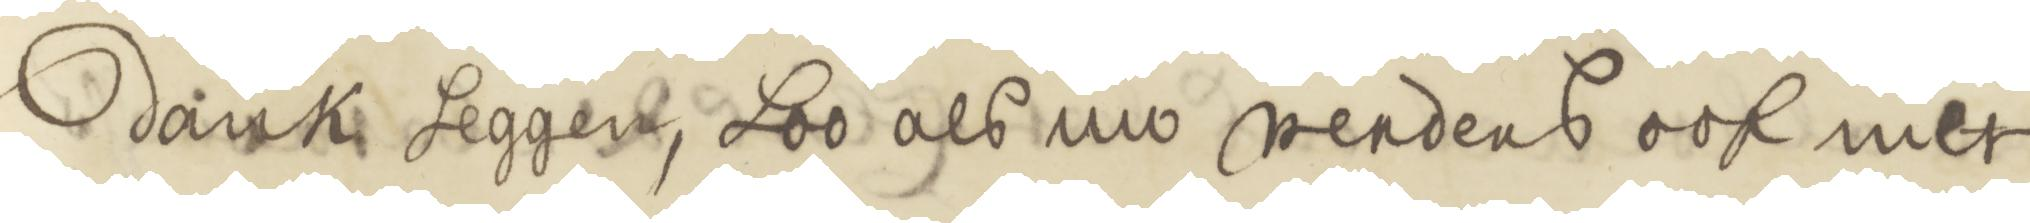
dank seggen, soo als uw verders ook niet
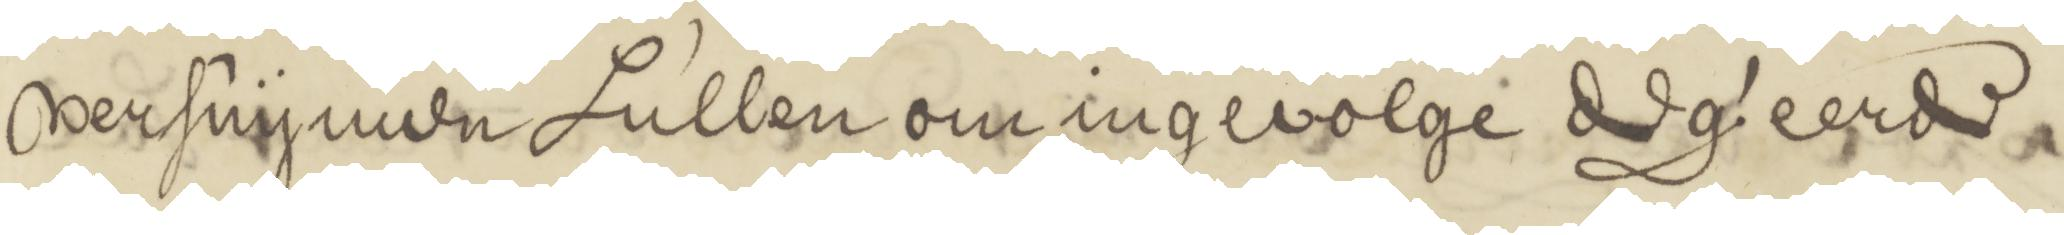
versuijmen sullen om ingevolge de g'eerde
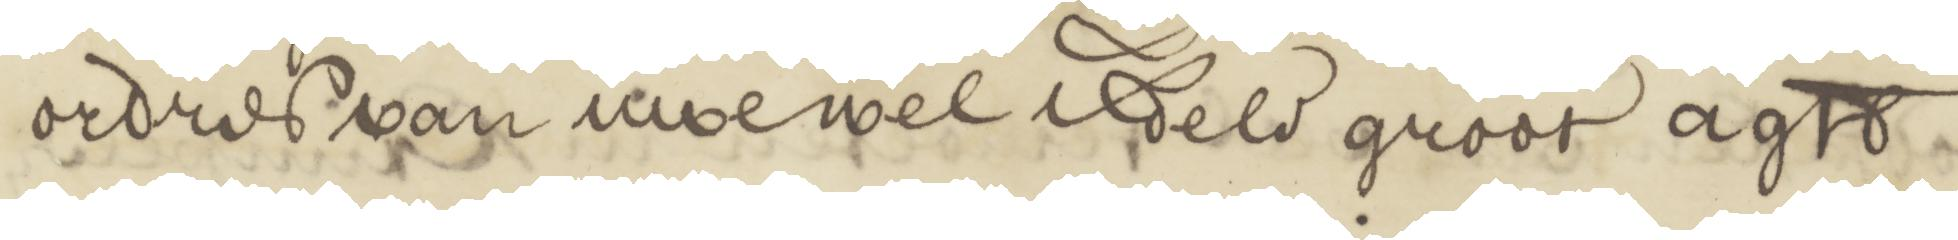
ordres van uwe wel Edele groot agtb
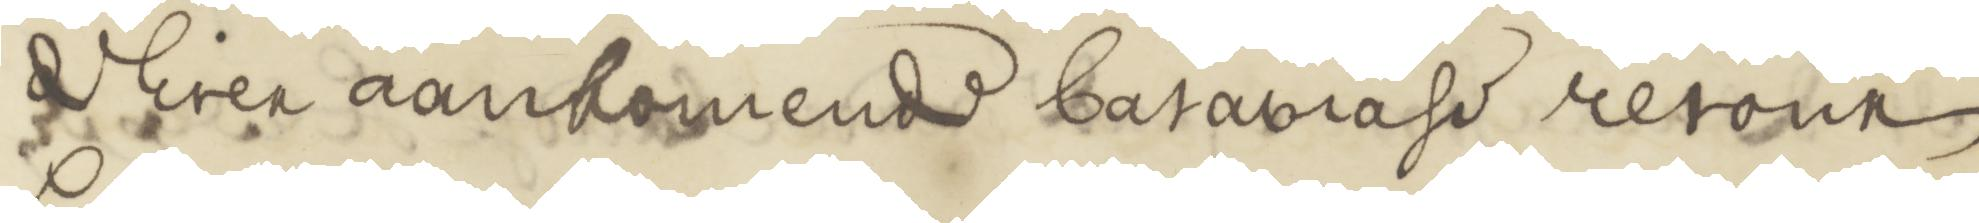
de hier aankomende bataviase retour
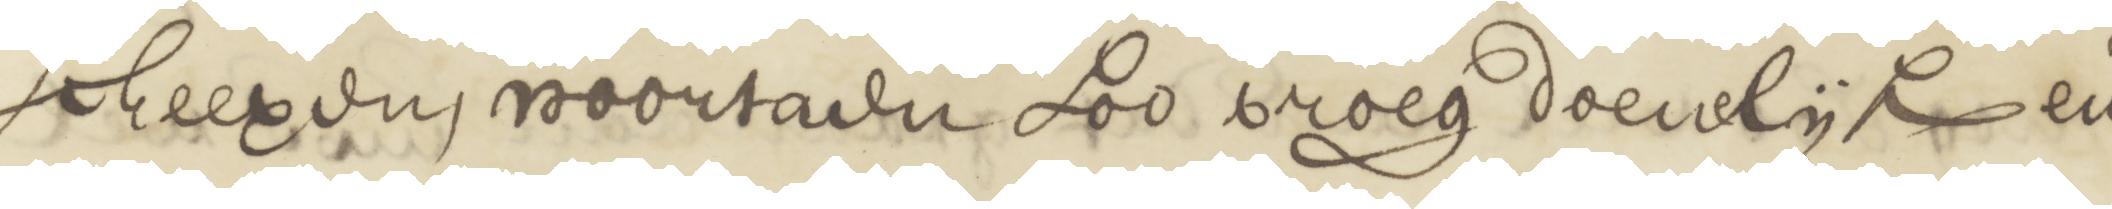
scheepen, voortaen soo vroeg doenelijk e
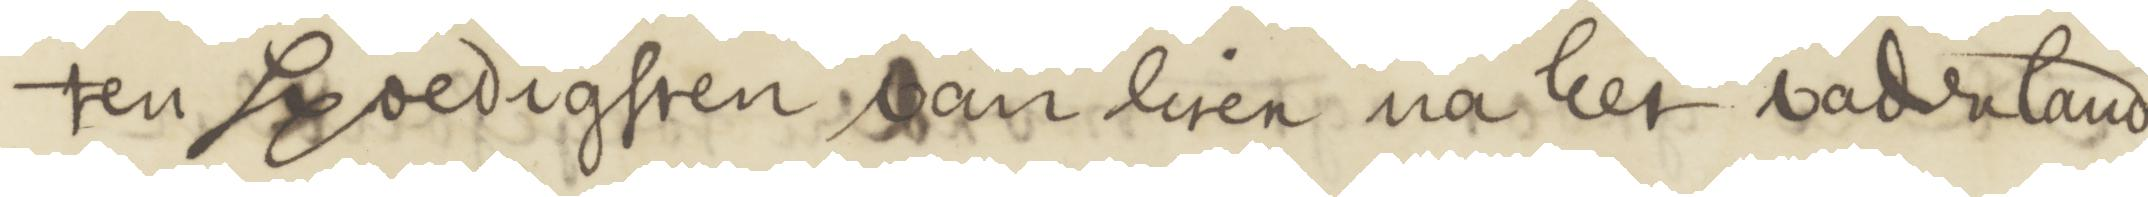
ten spoedigsten van hier na het vaderland
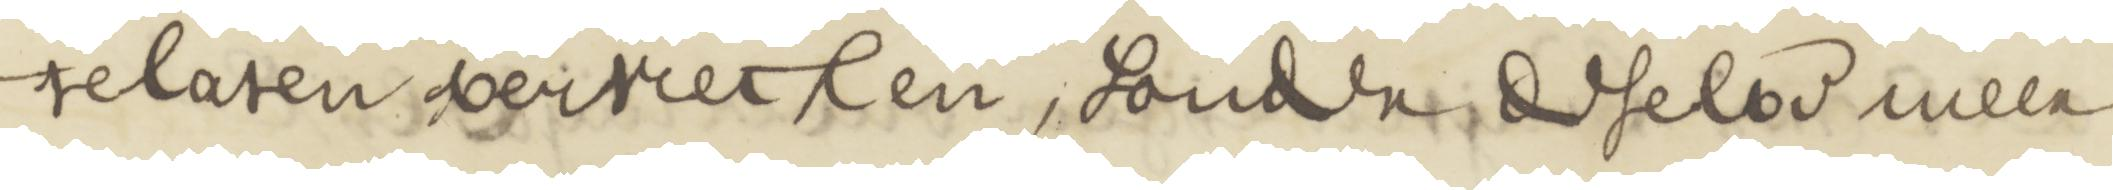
telaten vertrecken, sonder deselve meer
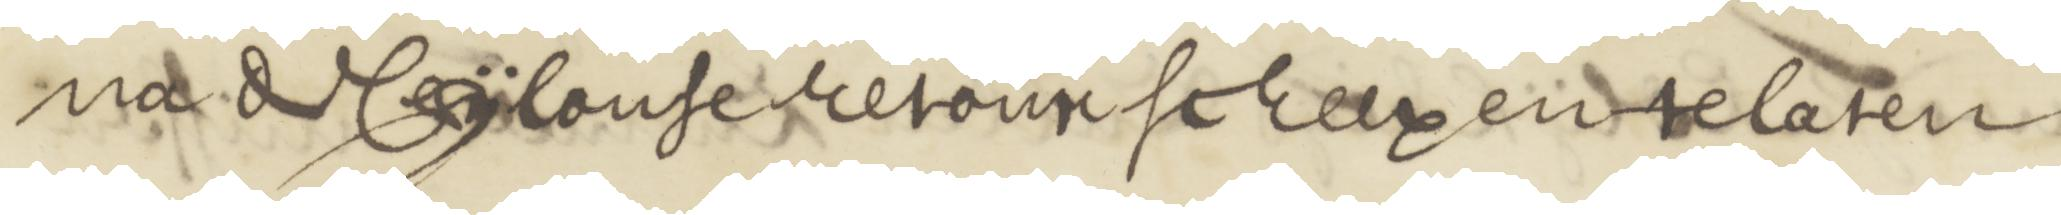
na de Ceijlonse retour scheepen te laten
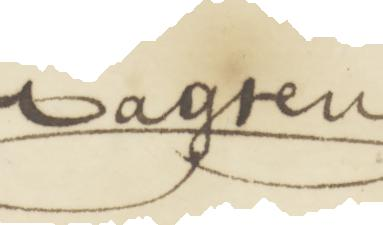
vagten
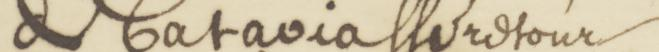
de bataviasso retour
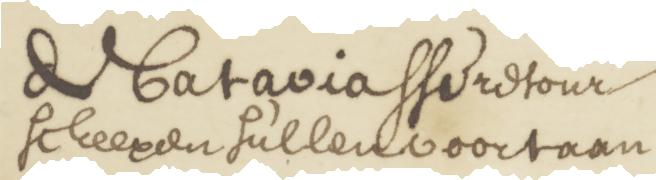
scheepen sullen voortaan
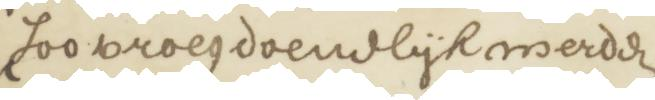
soo vroeg doenelijk werden
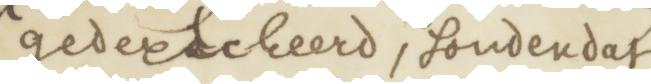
gedepecheerd, sonder dat
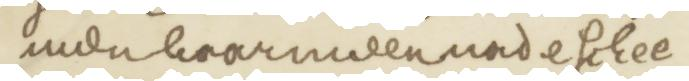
men haar meer na de schee
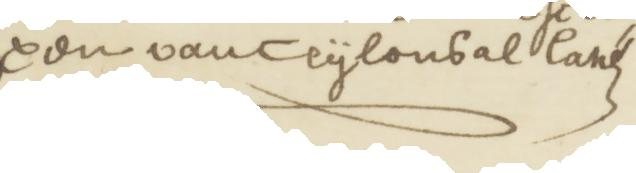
pen van ceijlon sal laten
